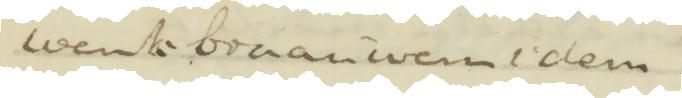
wenkbraauwem idem
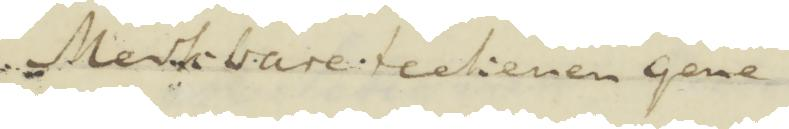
Merkbare teekenen gene
